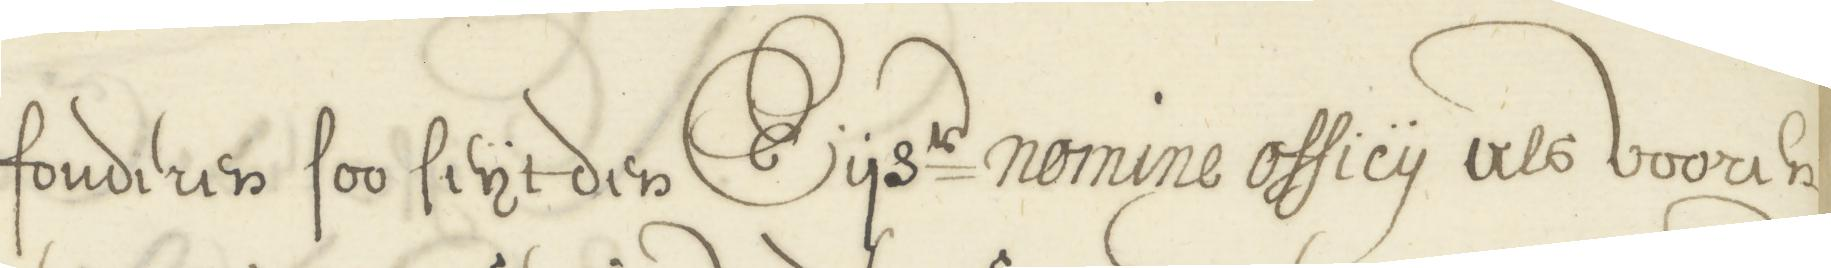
sonderen soo seijt den Eijs=r nomine officij als vooren
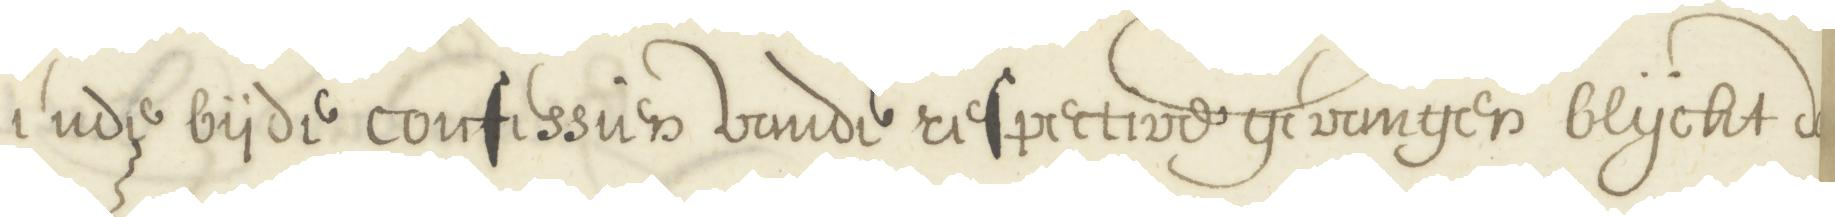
inde bij de confessien vande respective gevangen blijckt d
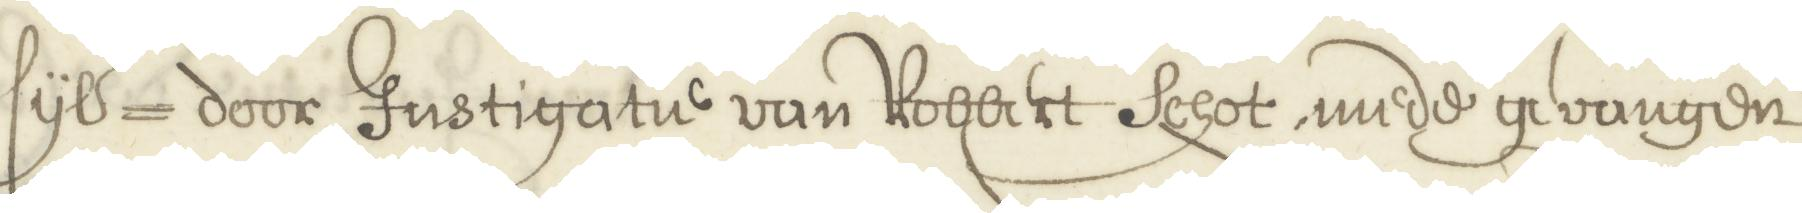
sijl= door Jnstigatie van Robbert Schot, mede gevangen
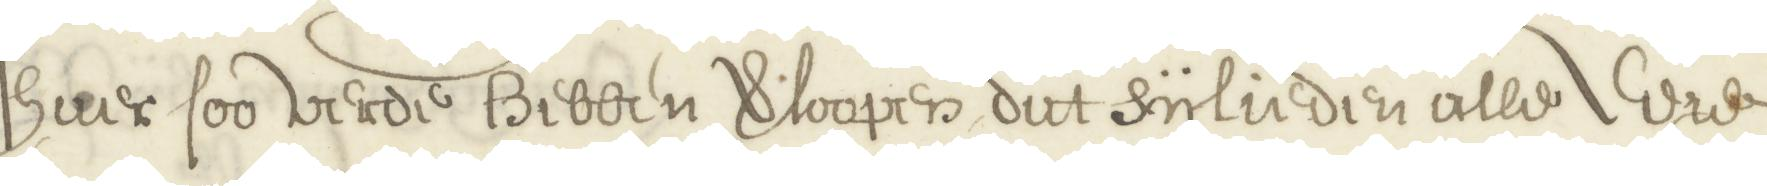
haer soo verde Hebben verloopen, dat sijlieden alle Eere
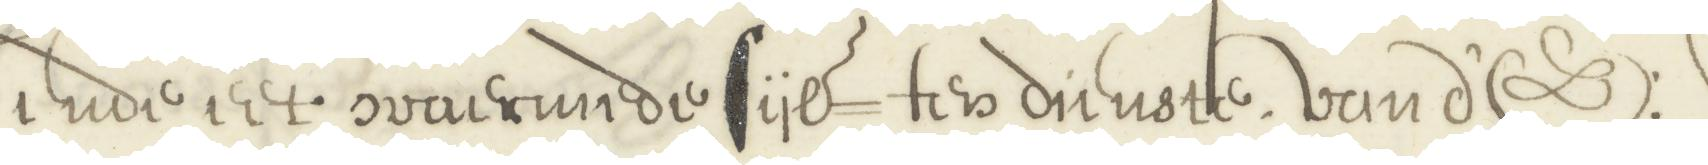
ende eet waermede sijl= ten dienste, van d’ E:
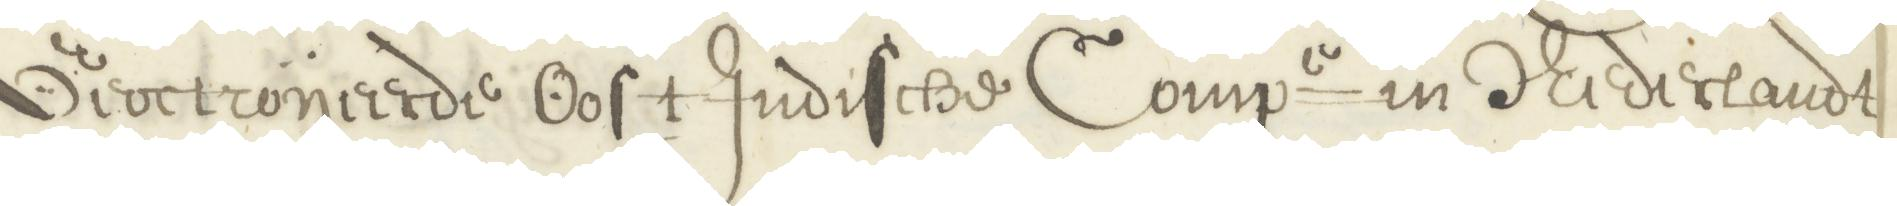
Geoctroijeerde Oost Indische Comp=e in Nederlandt
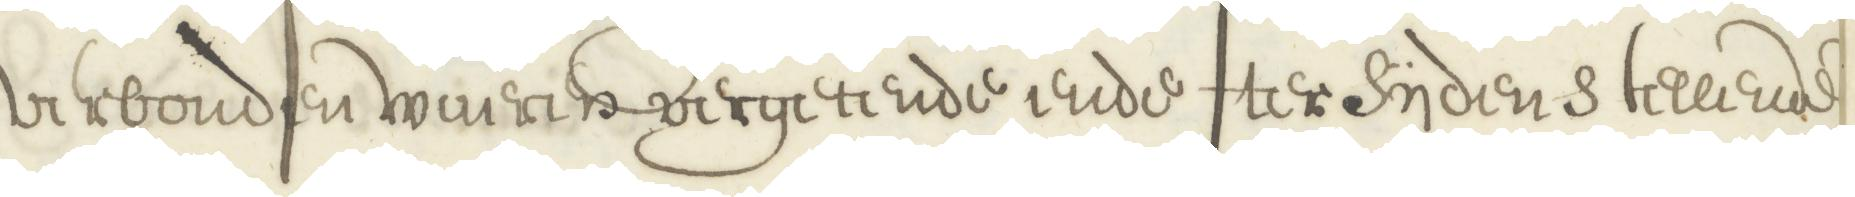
verbonden waeren vergetende ende ter sijden stellende
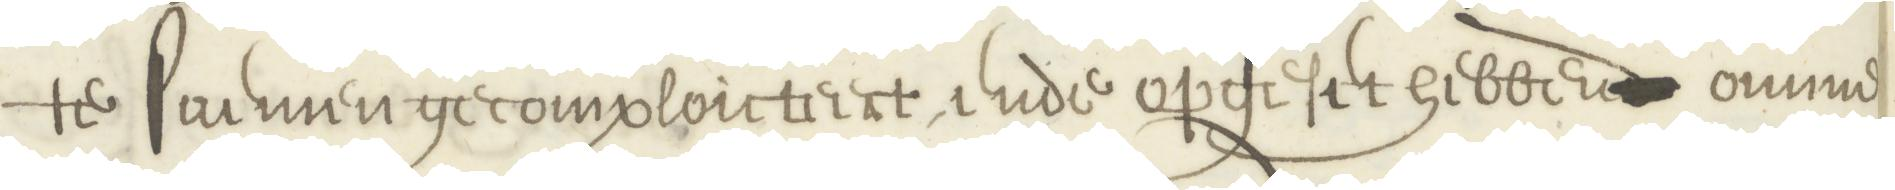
te saemen gecomploicteert, ende opgeset hebben omme
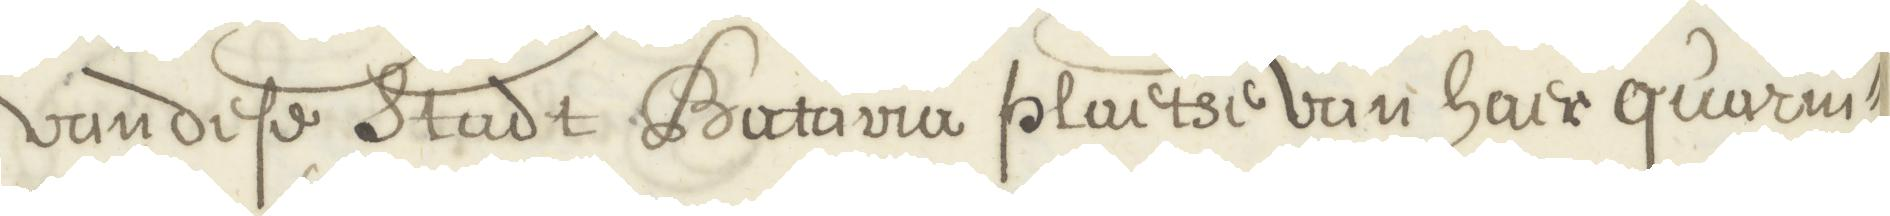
van dese stadt Batavia plaetse van haer quarni„
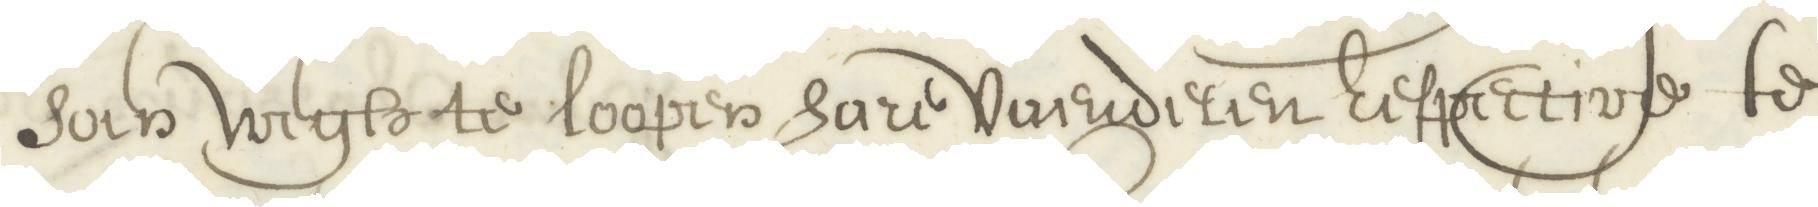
soen wegh te loopen hare vaendelen respective te
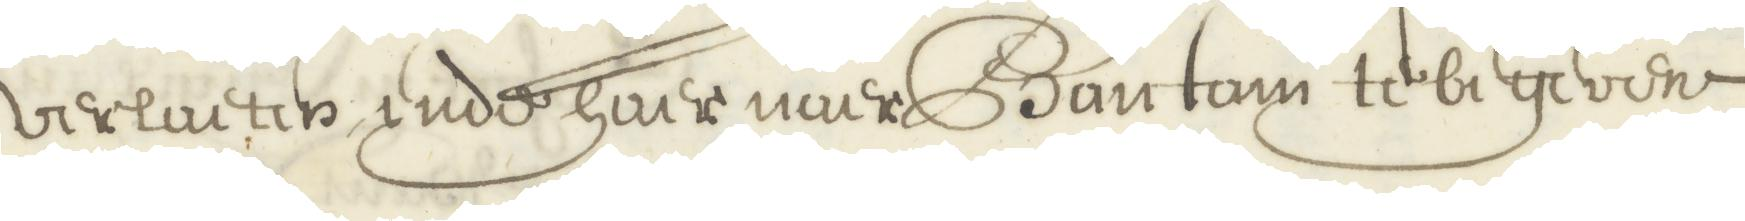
verlaeten, ende haer naer Bantam te begeven
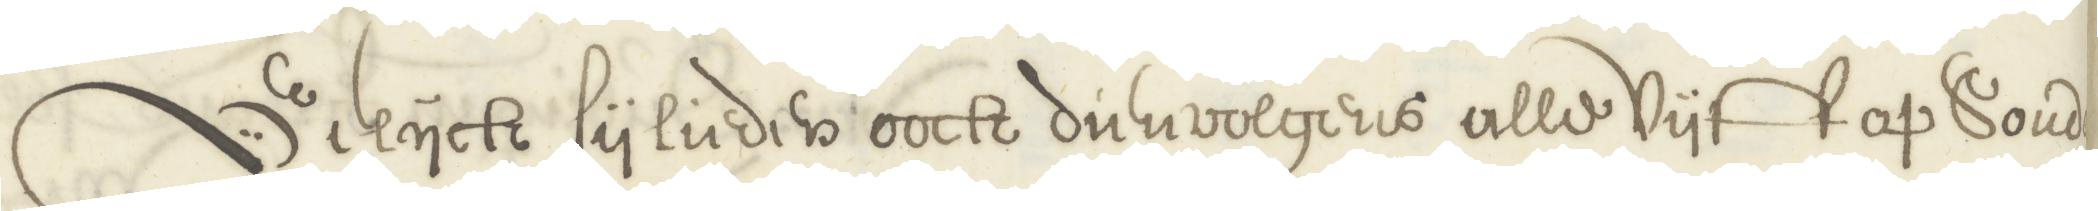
Gelijck sijlieden oock dienvolgens alle vijff op sond
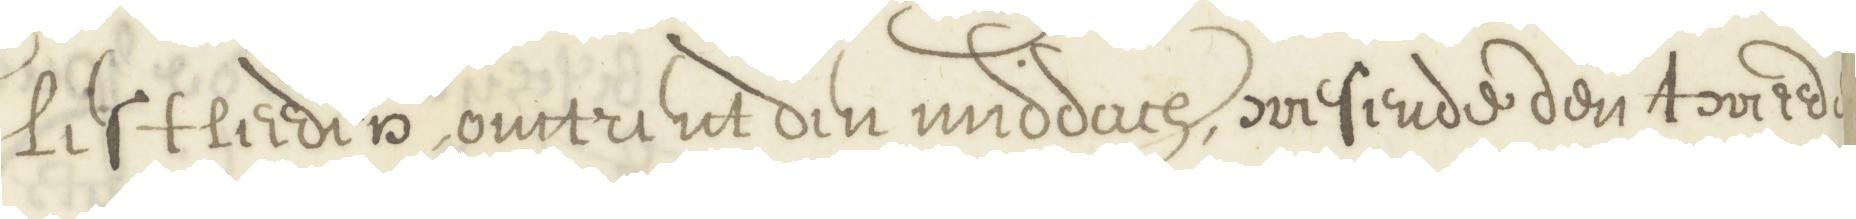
lestleeden, omtrent den middag, wesende den tweede
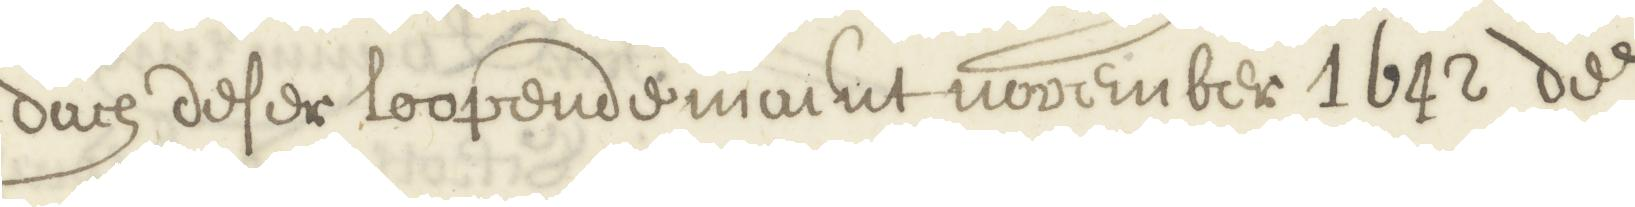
dag deser loopende maent november 1642 de
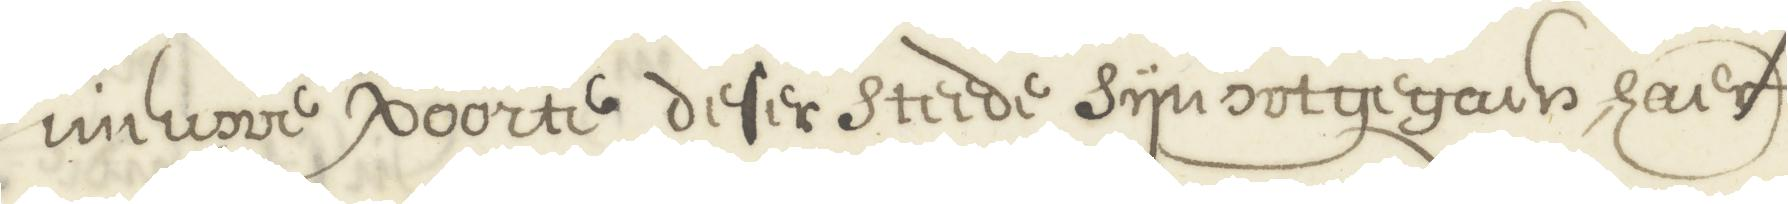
nieuwe poorte deser steede sijn wtgegaen, haer
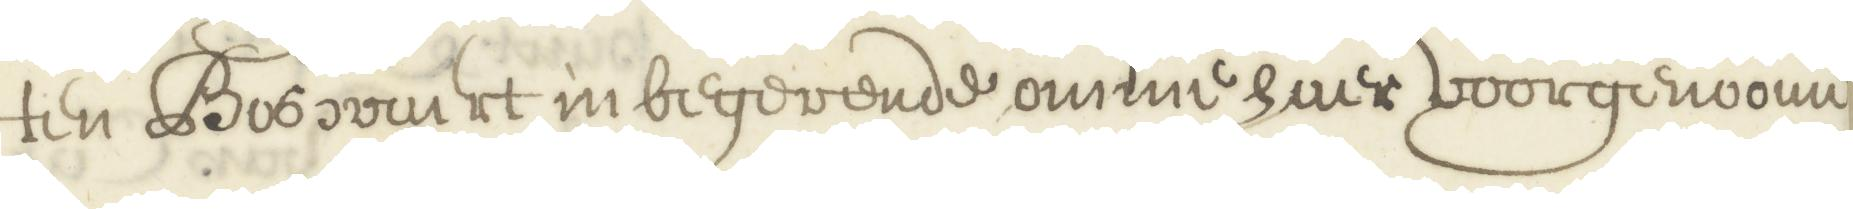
ten Boswaert in begevende omme haer voorgenoomen
